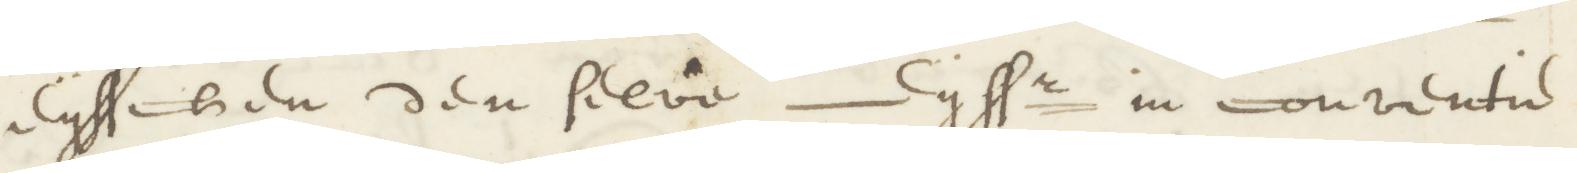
Eijsschen den selve Eijss=r in conventie
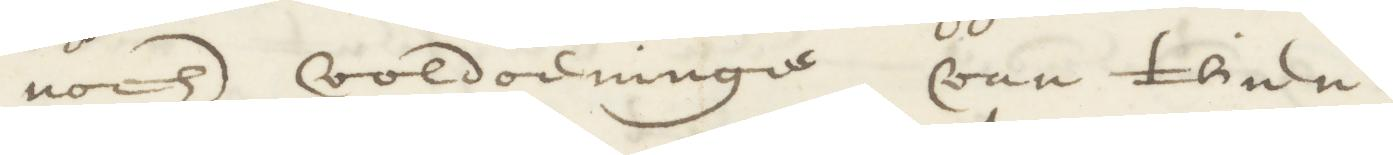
noch voldoeninge van thien
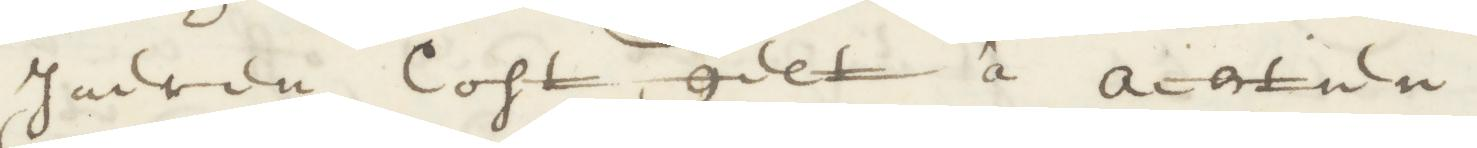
Jaeren Cost gelt â achtien
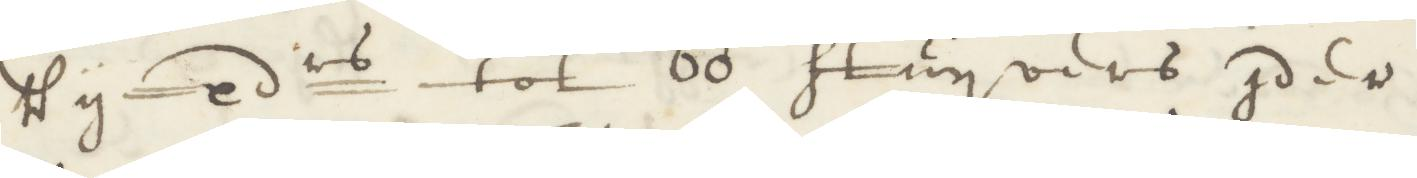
Rijcxd=rs tot 60 stuijvers jder
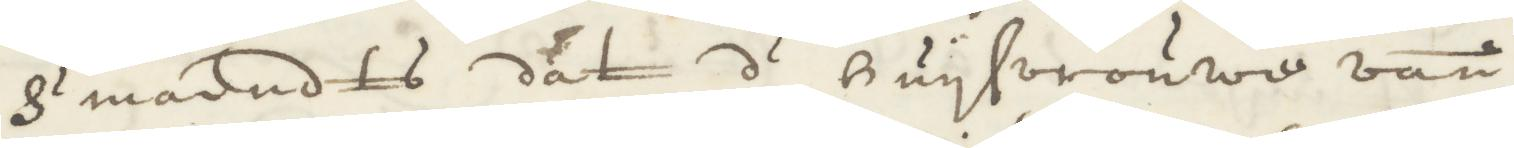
3' maendts dat d’ huijsvrouwe van
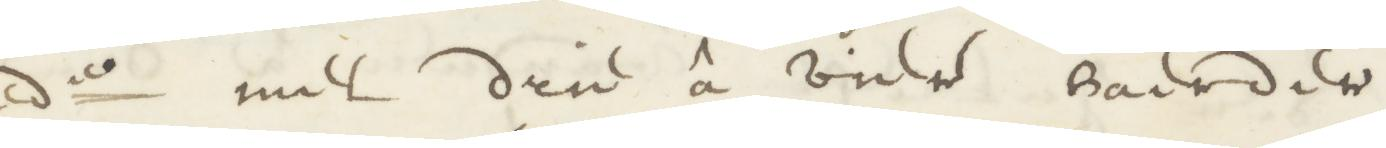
ged=e met drie â vier haerder
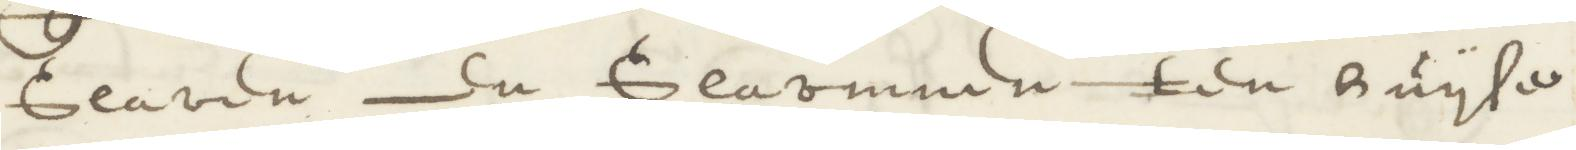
Slaven en Slavinnen ten huijse
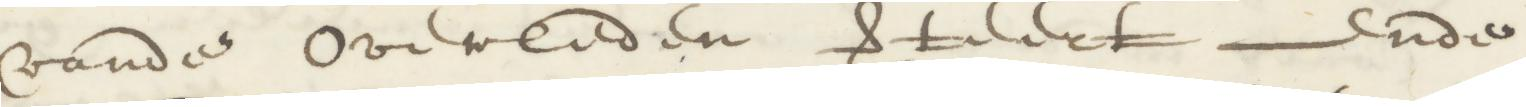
vande Overleden verteert Ende
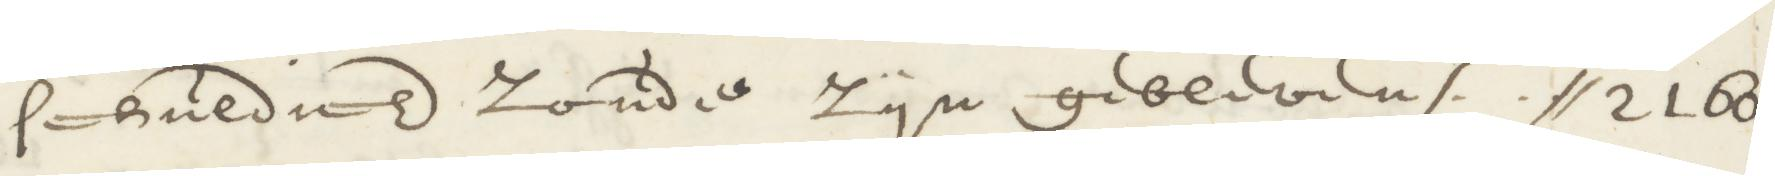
schuldich zoude zijn gebleven / - - „ 2160
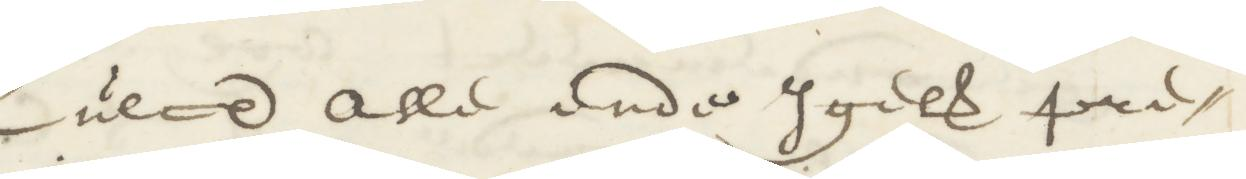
Zulcx alle ende Jgel pre„
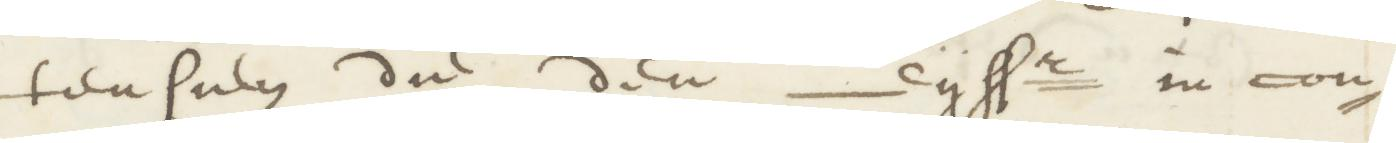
tensien die den Eijss=r in con„
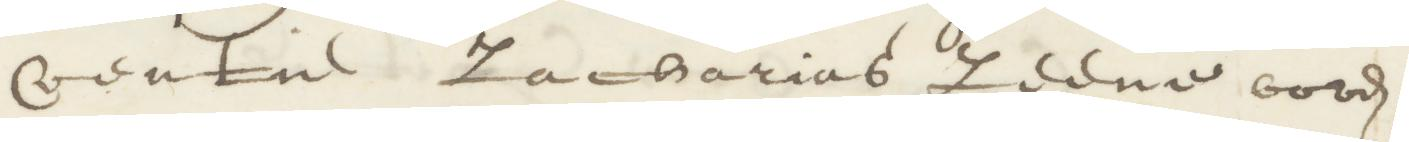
ventie Zacharias Zeene voren
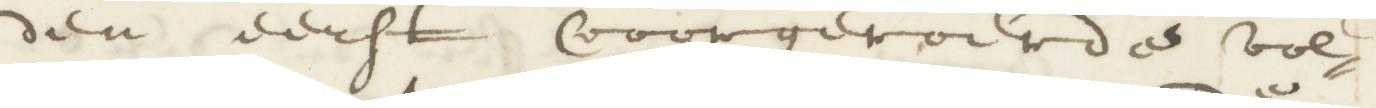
den eerst voorgeroerde vol„
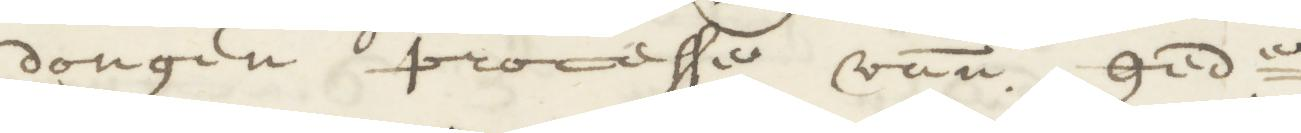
dongen processe van ged=e
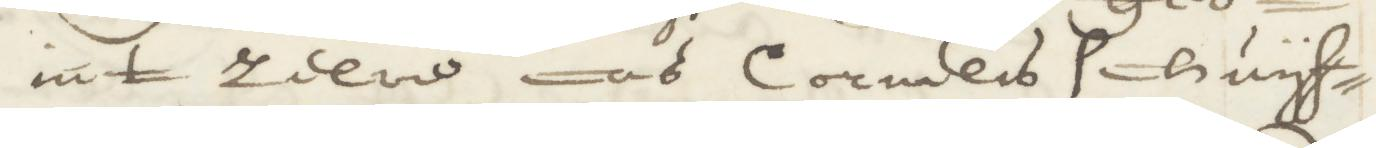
in t zelve cas Cornelis schuijf„
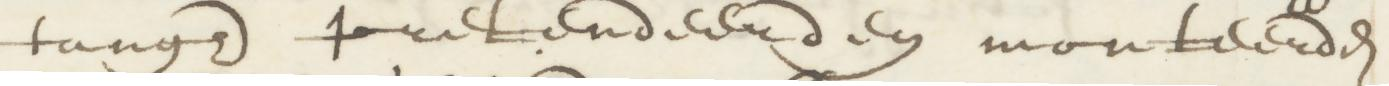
tangh pretendeerden monteerden
